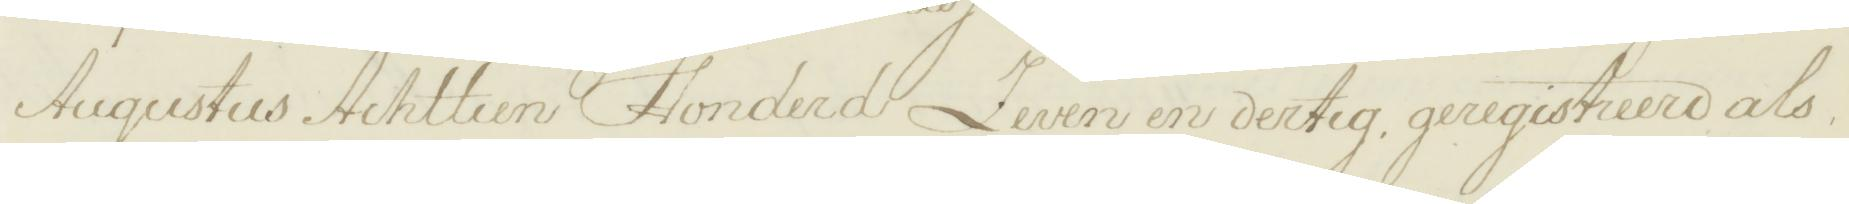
Augustus Achttien Honderd Zeven en dertig, geregistreerd als.
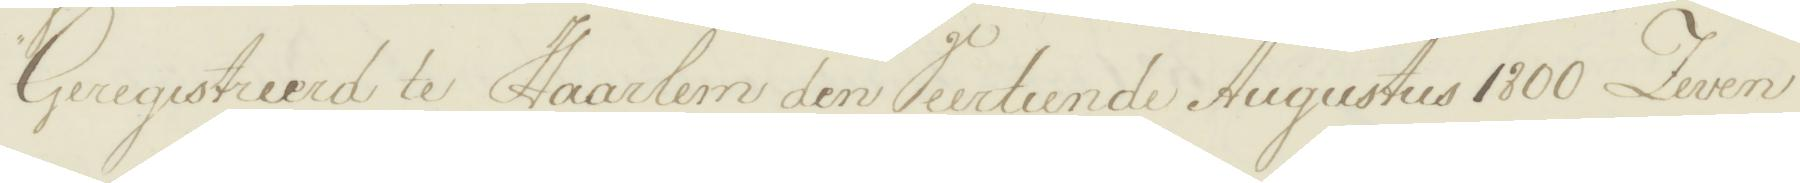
Geregistreerd te Haarlem den Veertiende Augustus 1800 Zeven
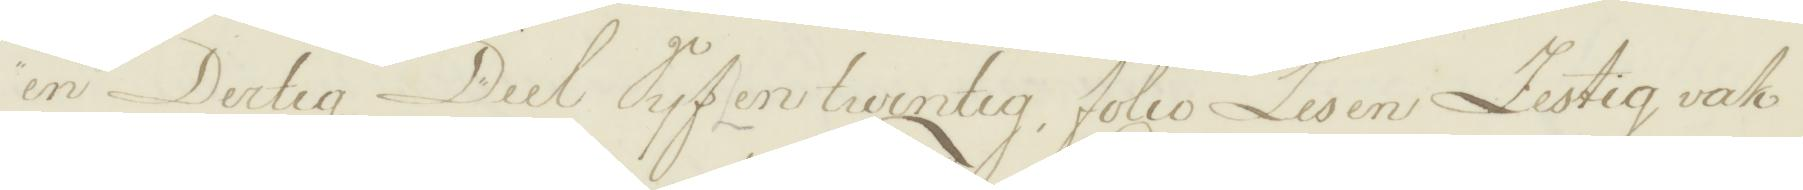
en Dertig Deel Vyf en twintig, folio Zesen Zestig vak
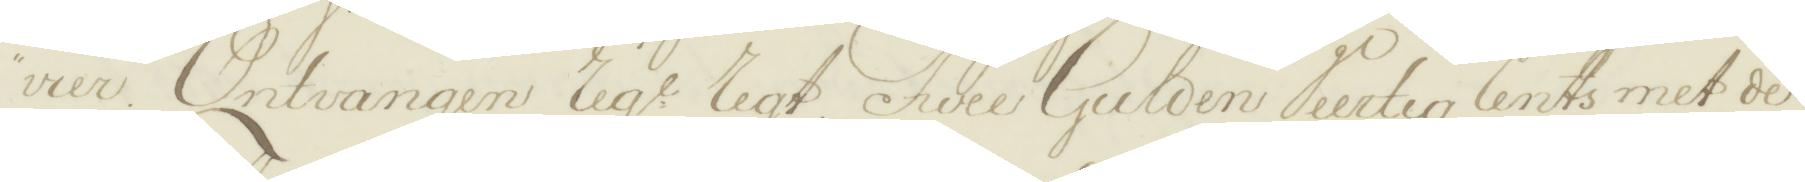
vier. Ontvangen Reg:s Regt, Twee Gulden Veertig Cents met de
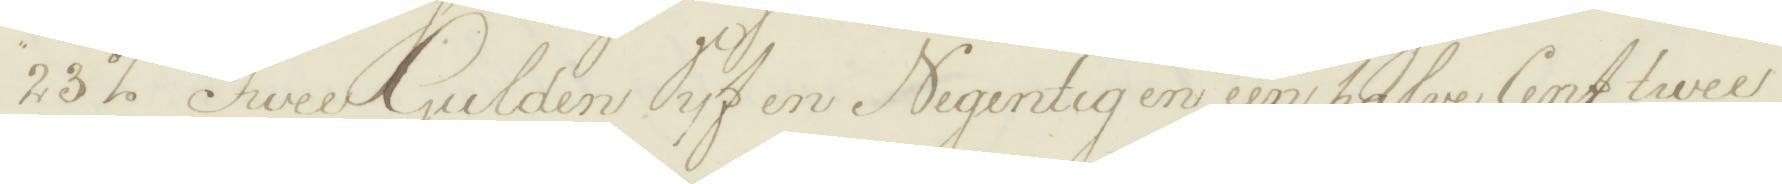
23% Twee Gulden Vyf en Negentig en een halve Cent twee
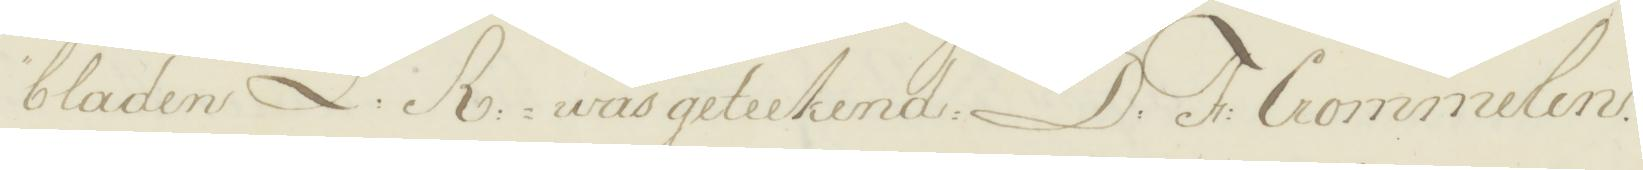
bladen L: R: -was geteekend: D: F: Crommelin.
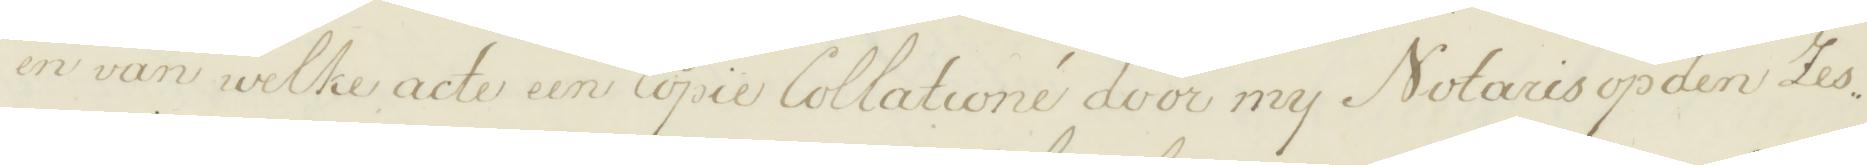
en van welke acte een copie Collationé door my Notaris op den Zes„
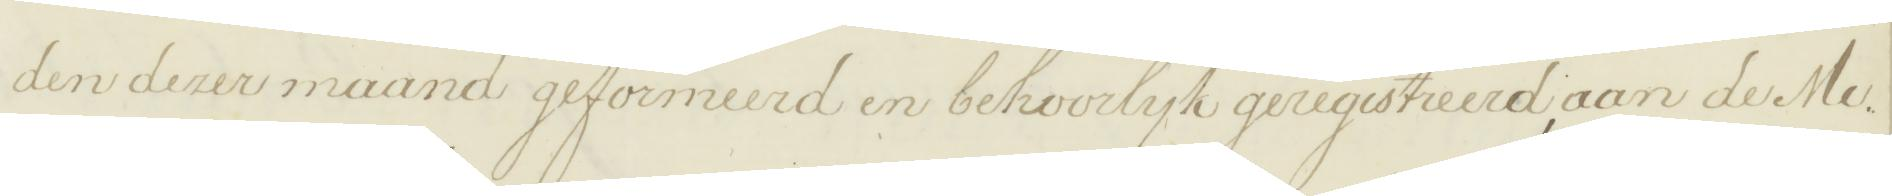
den dezer maand geformeerd en behoorlyk geregistreerd, aan de Mi„
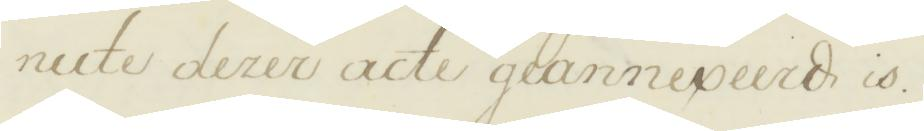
nute dezer acte geannexeerd is.
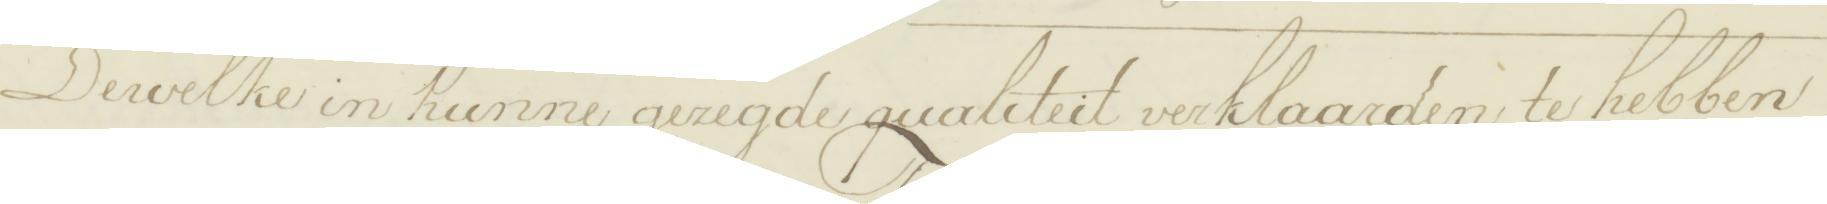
Dewelke in hunne gezegde qualiteit verklaarden te hebben
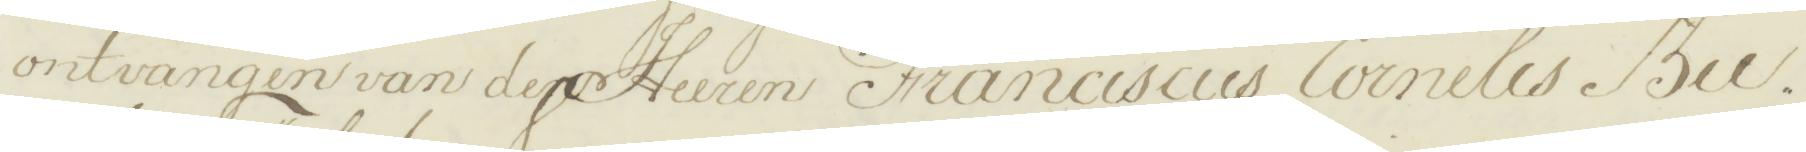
ontvangen van de Heeren Franciscus Cornelis Bu„
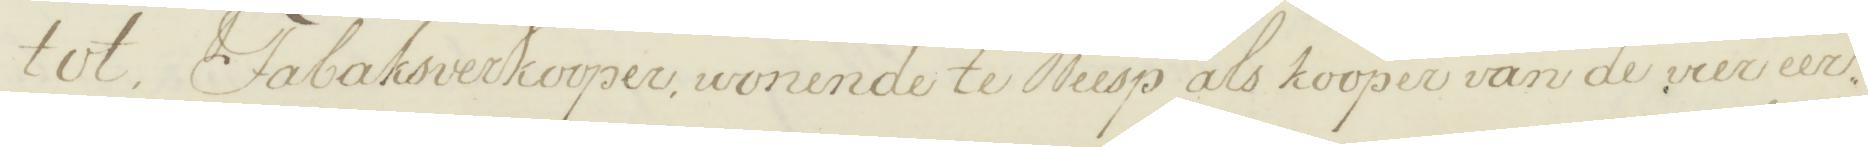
tot, Tabaksverkooper, wonende te Weesp als kooper van de vier eer„
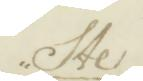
ste
